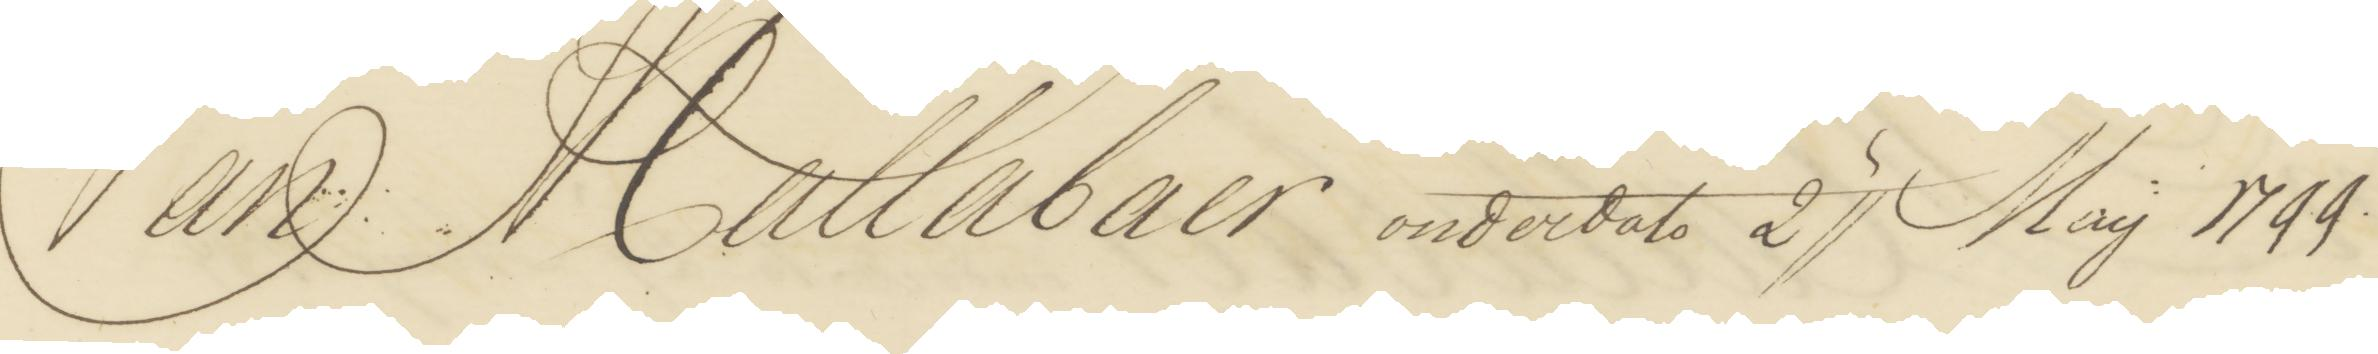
Van Mallabaer onder dato 2„' Maij 1744:
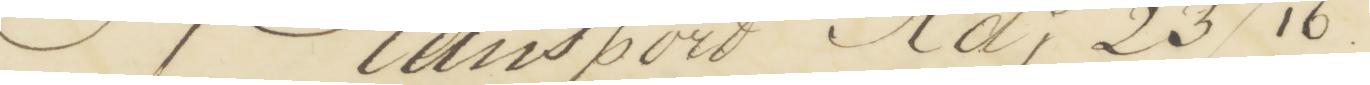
P„r Transport Rd„s 23 1/16.
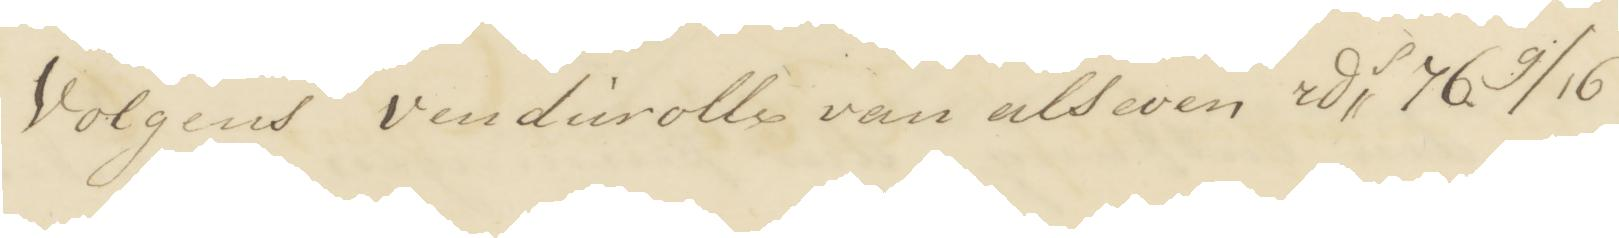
Volgens vendurolle van als even rd„s 76. 9/16
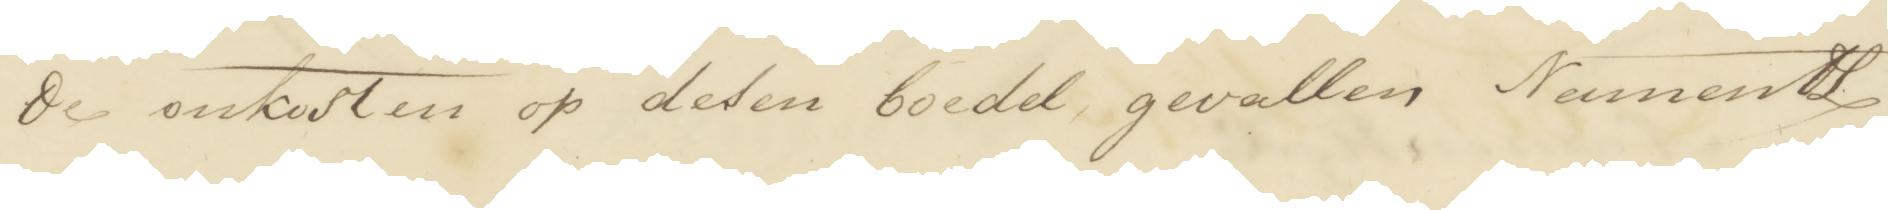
de onkosten op desen boedel, gevallen Namentl
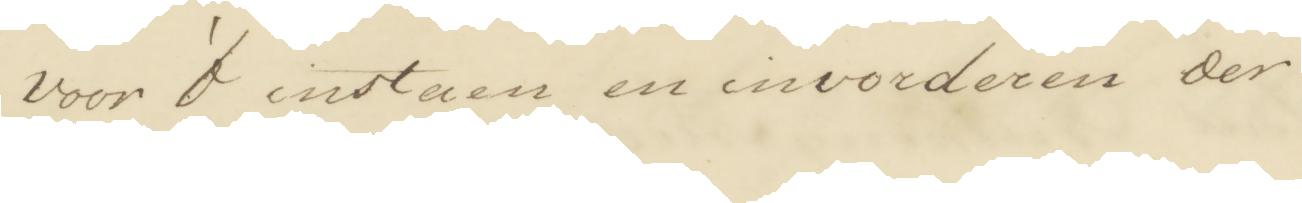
voor 't instaen en invorderen der
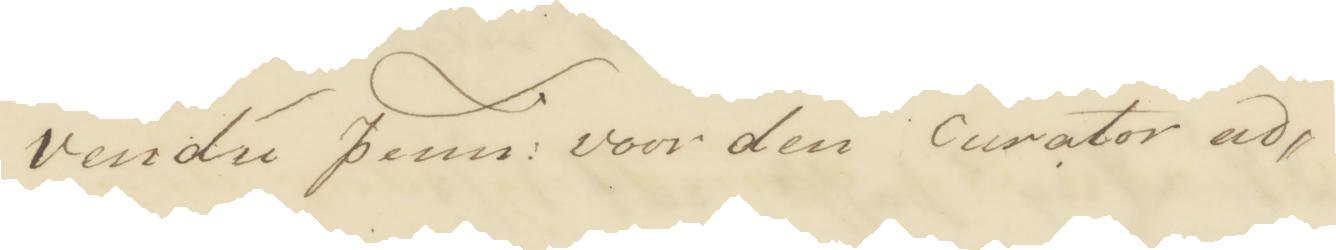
vendu penn: voor den curator ad„
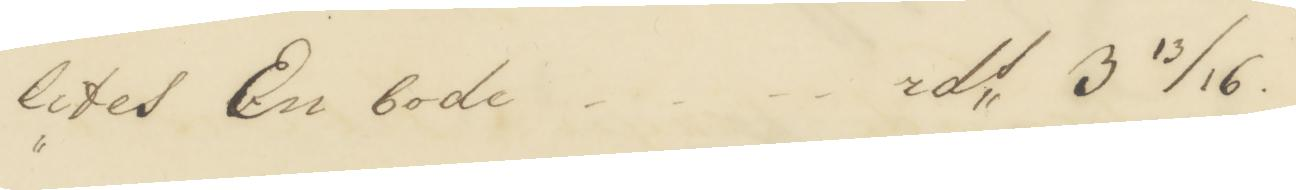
„lites En bode - - - - rd„s 3 13/16.
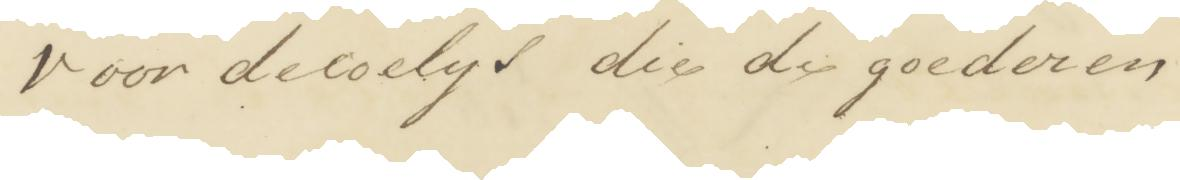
Voor de coelijs die de goederen
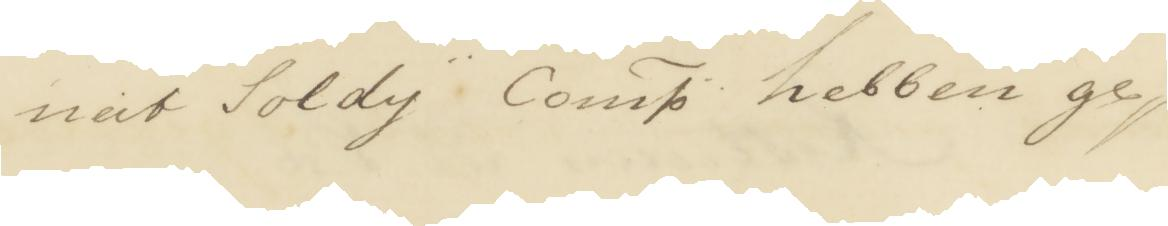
na't soldij Comp: hebben ge„
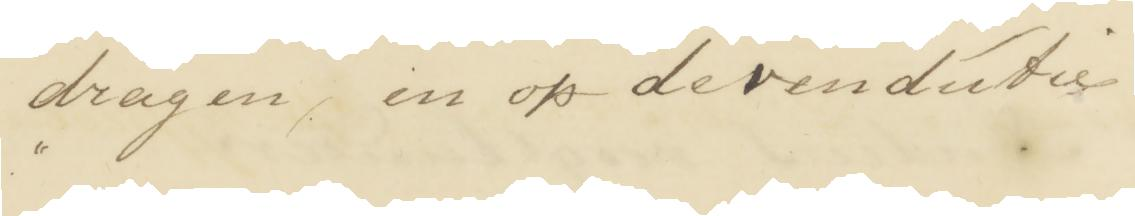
dragen, en op devendutie
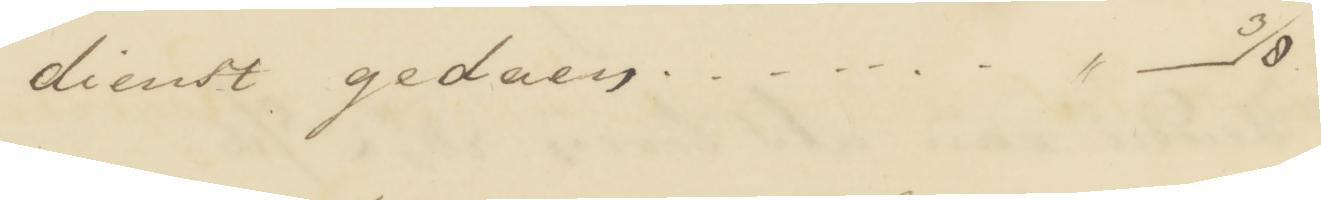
dienst gedaen - - - - - - - „ —3/8.
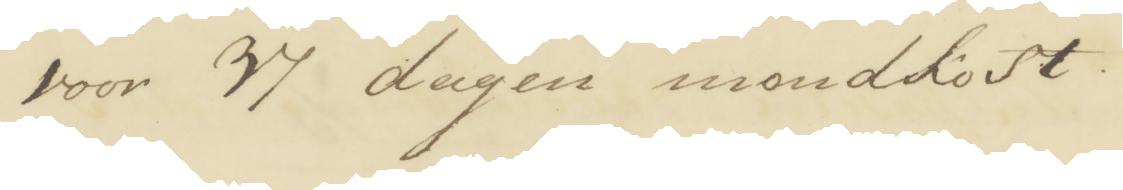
voor 37 dagen mondkost.
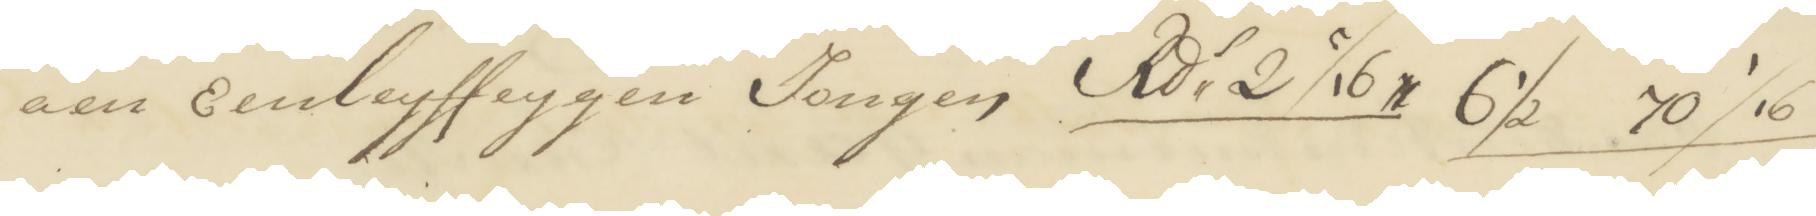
aen Eenleyffeygen Iongen Rd„s 2 5/16 „ 6½ 70 1/16
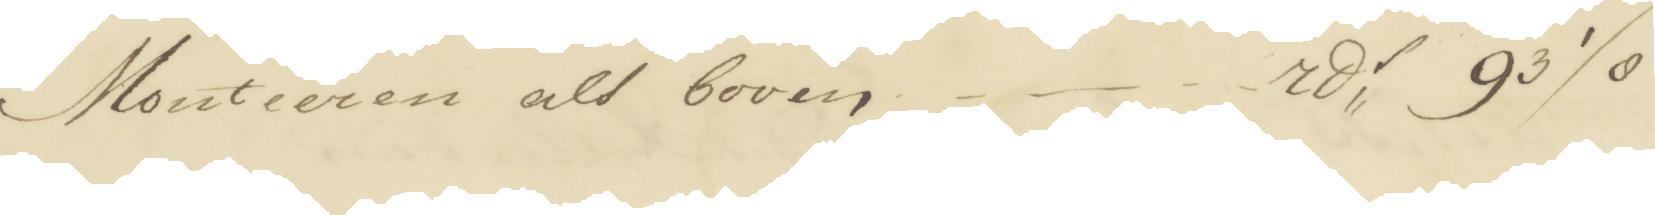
Monteeren als boven - - - - - - rd„s 93 1/8
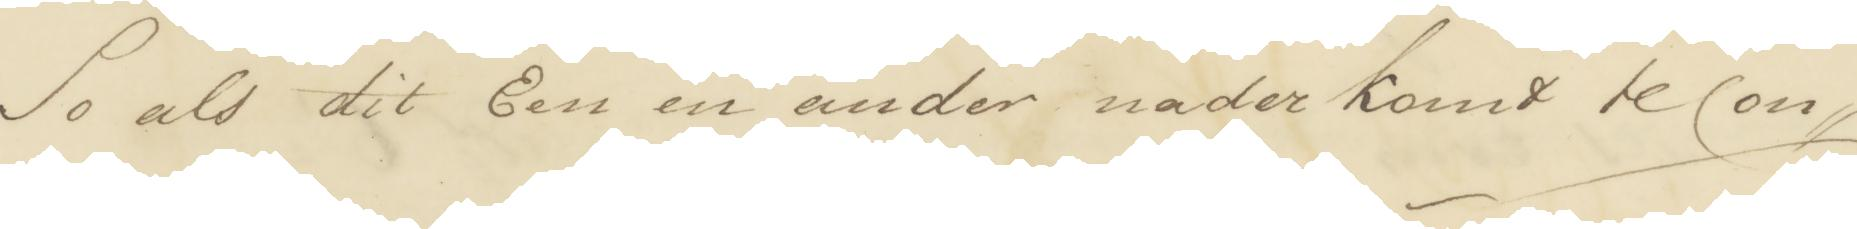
So als dit Een en ander nader komt te Con„
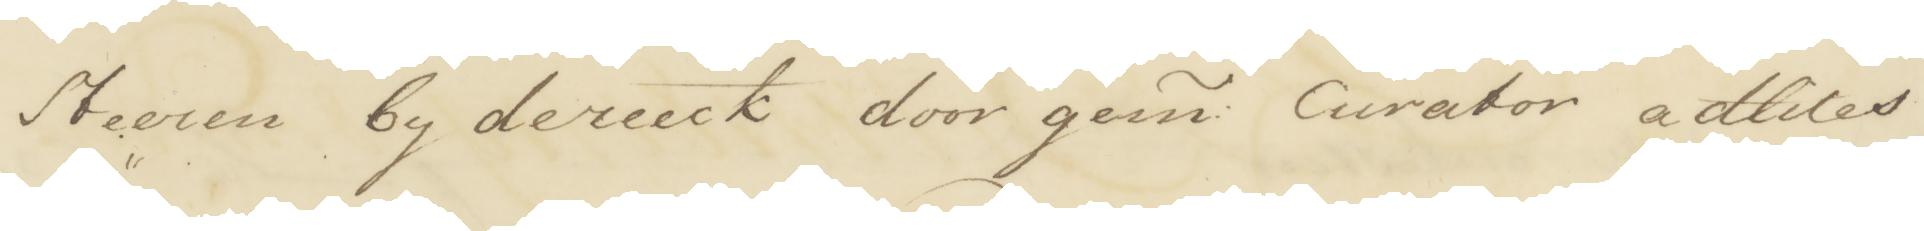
steeren bij dereeck door gem: Curator adlites
